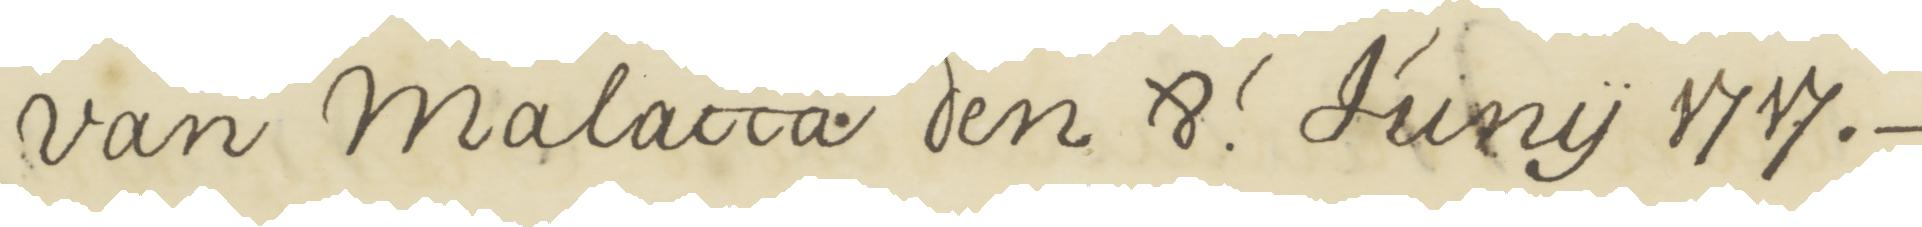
van Malacca den 8.' Junij 1717.
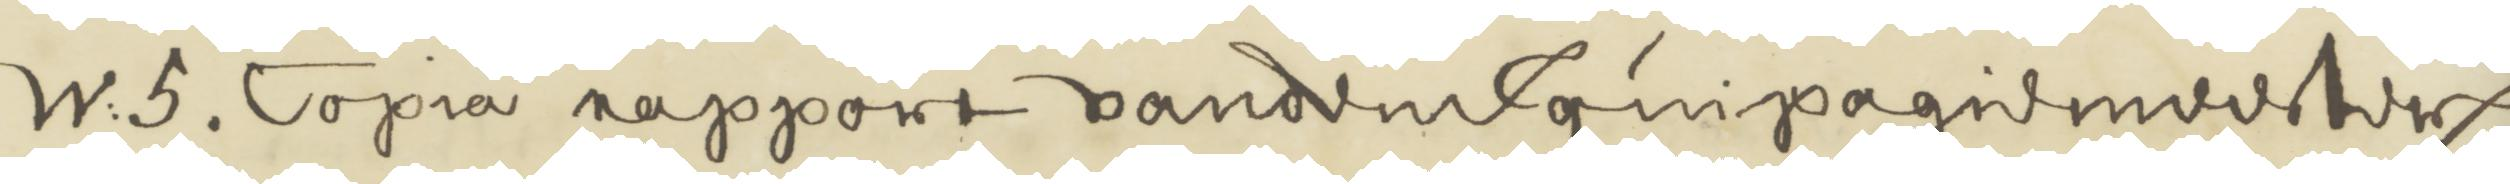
W: 5. Copia rapport van den Equipagiemeester
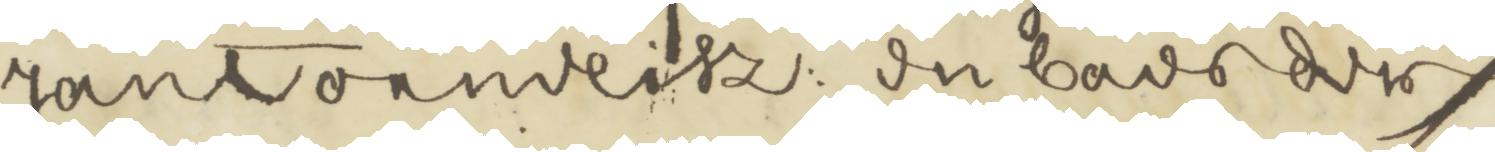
Jan Cornelisz: en baes der
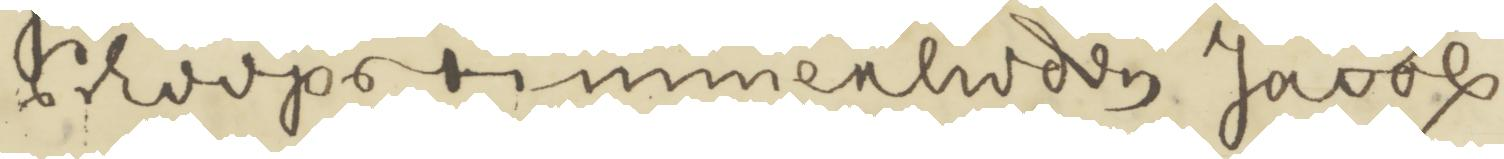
scheepstimmerlieden Jacob
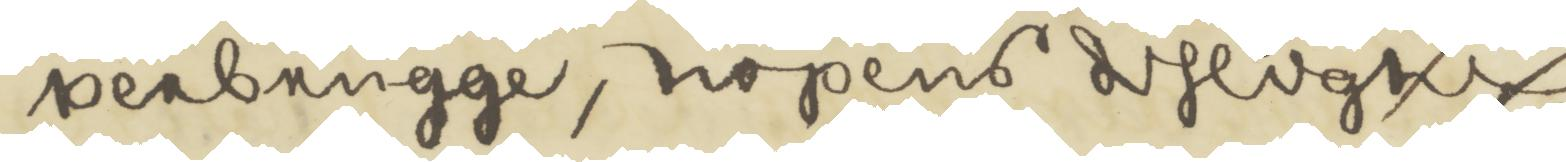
verbrugge, nopens de slegte
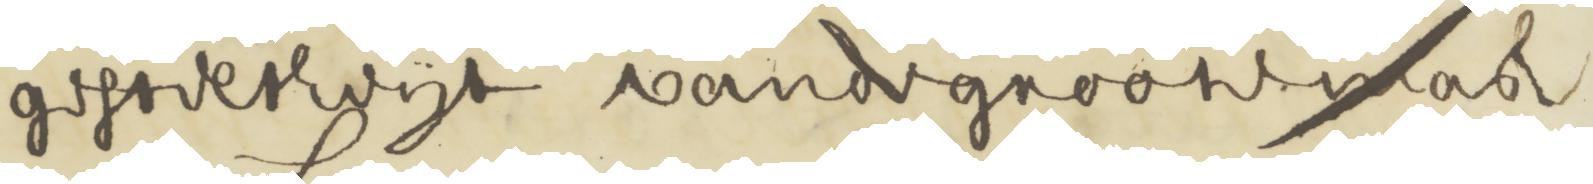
gesteltheijt van de groote mast
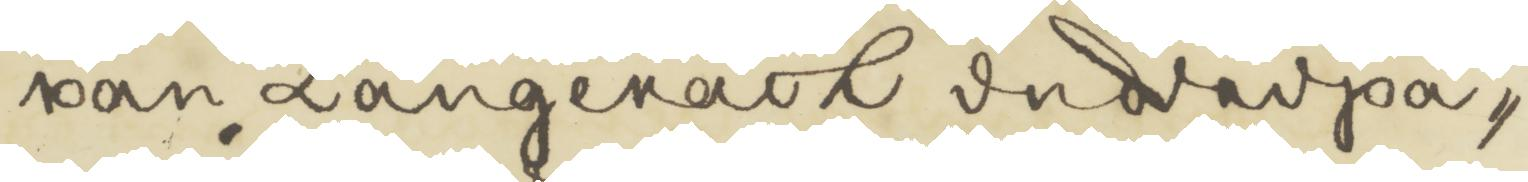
van Langerack en de repa„
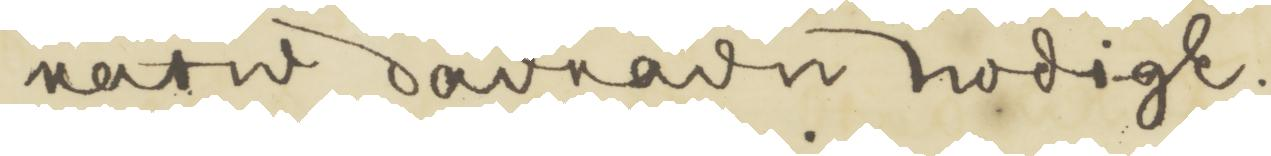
ratie daeraen nodigh.
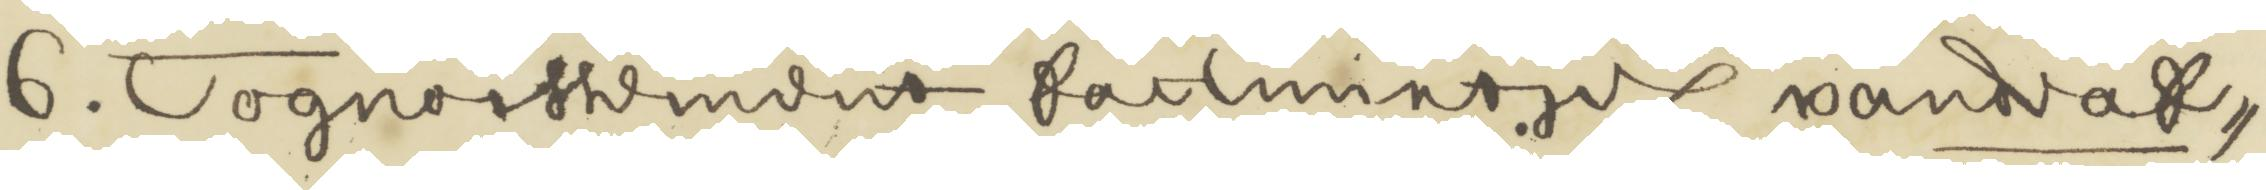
6. Cognoissement factuurtje van de af„
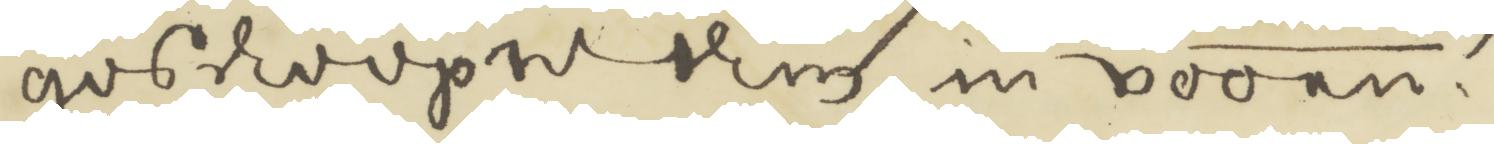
gescheepte thin in voorn:
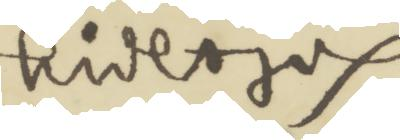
kieltje.
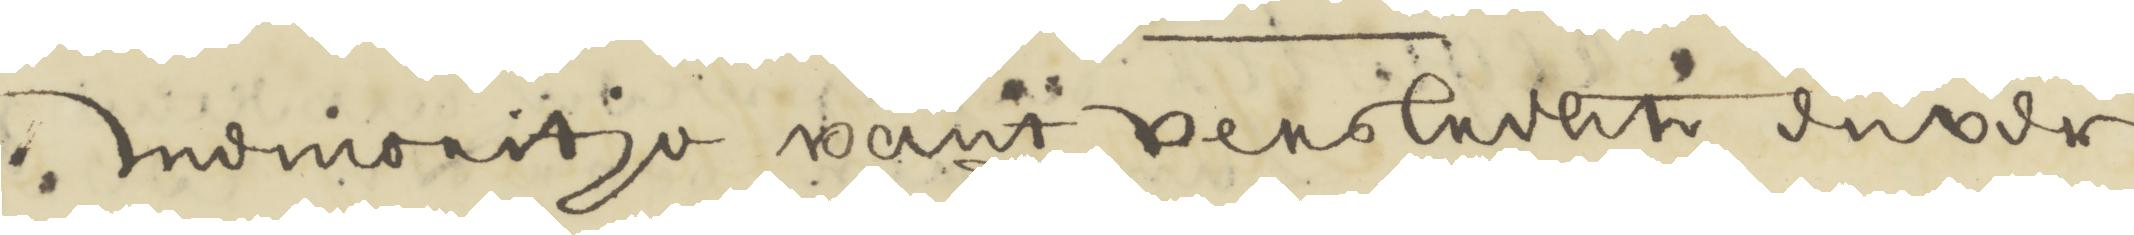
7. memoritje vant verstrekt en ver
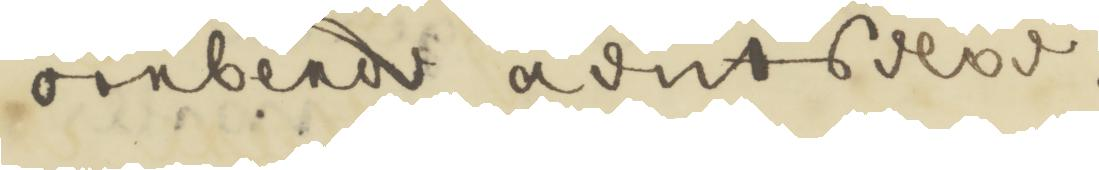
oirberde aentselve.
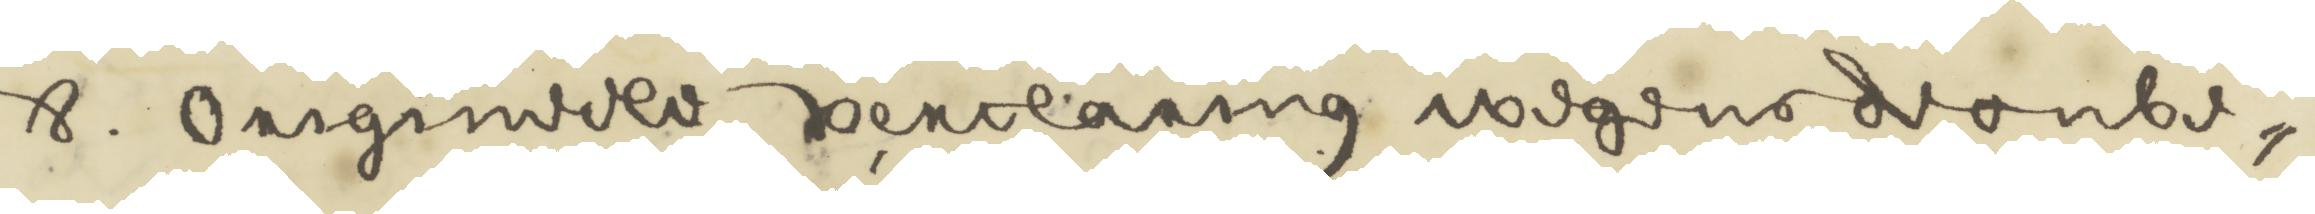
8. origineele verclaring wegens de onbe„
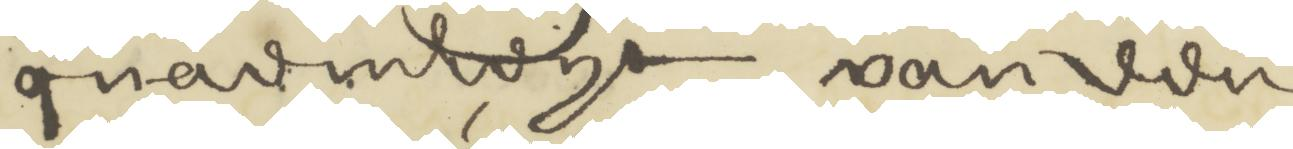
quaemteijt van een
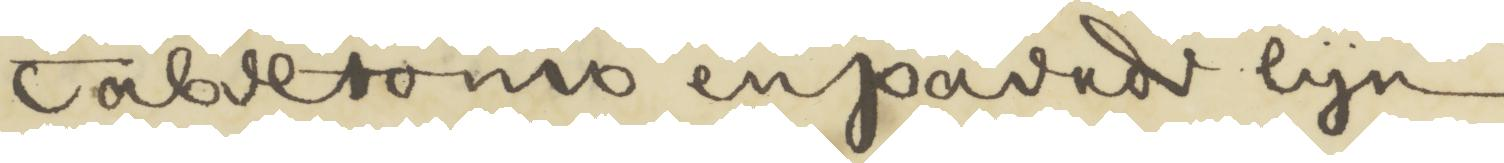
Cabeltouw en paerde lijn
